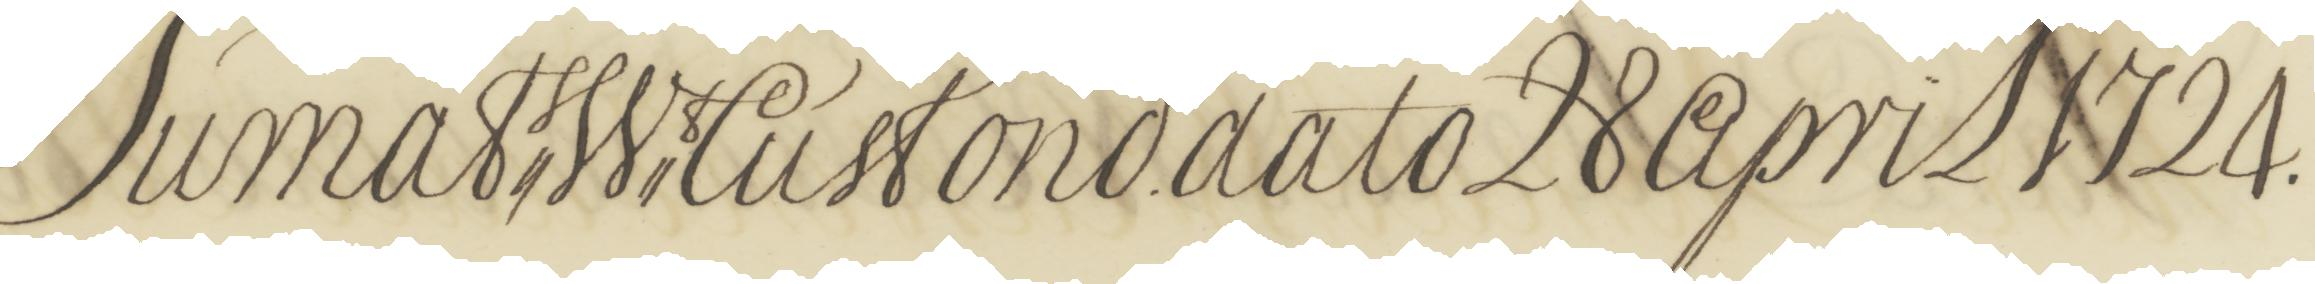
Sumat„s W„t Cust ond. dato 28 april 1724.
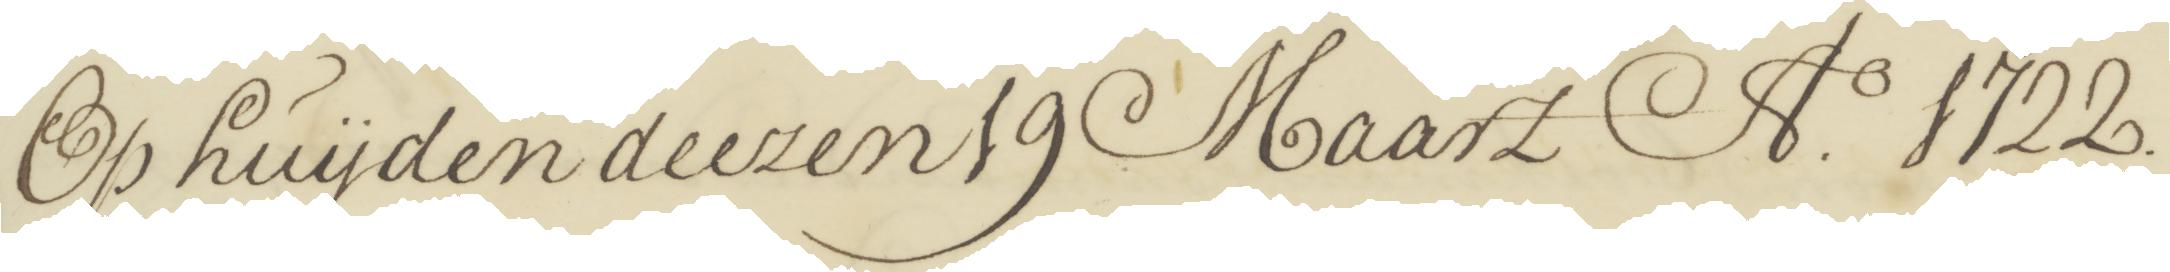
Op huijden deezen 19 Maart A.o 1722.
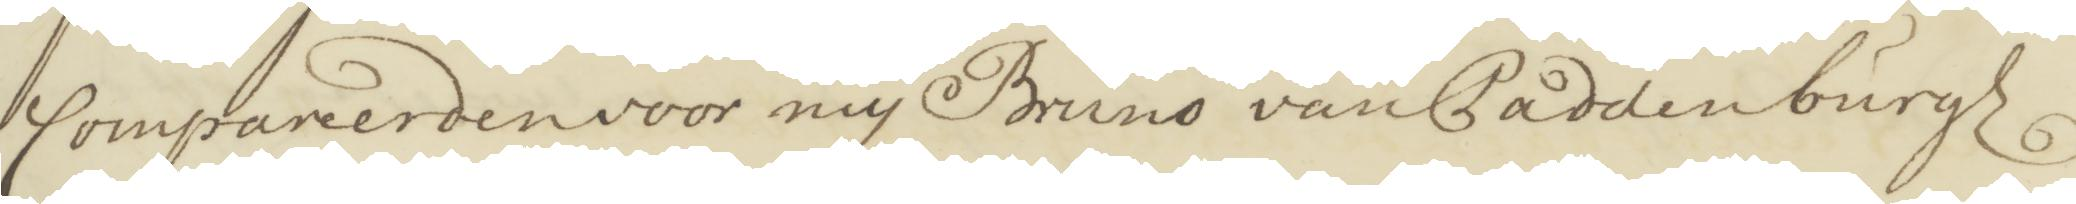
Compareerden voor my Bruno van Paddenburgh
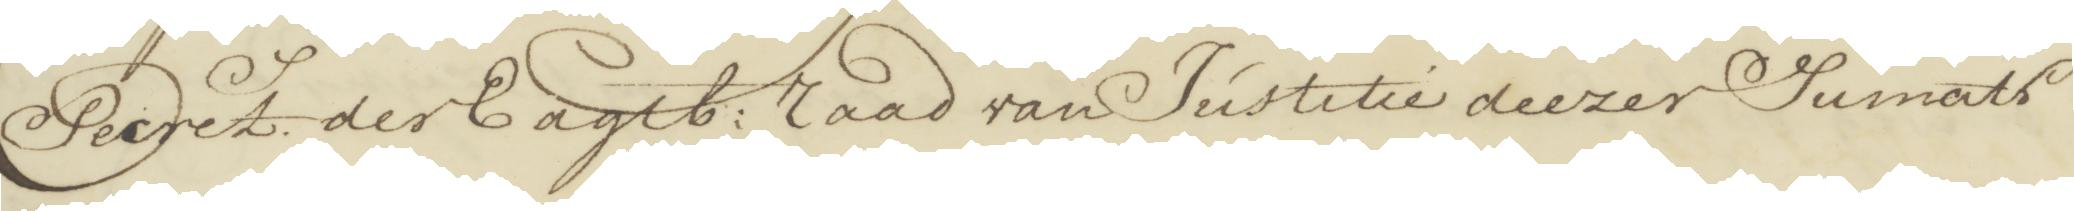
Secret.s der E agtb: Raad van Justitie deezer Sumats
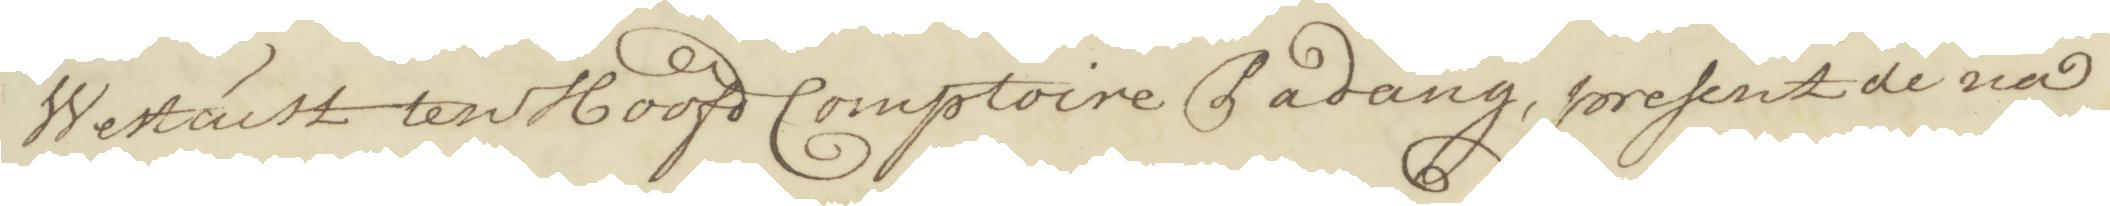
Westcust ten Hoofd Comptoire Padang, present de na
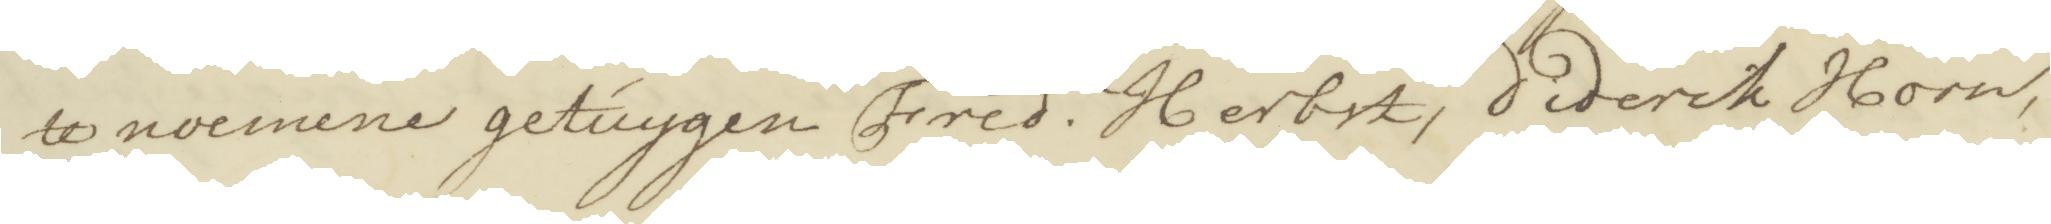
te noemene getuygen Fred.k Herbit, diderik Horn,
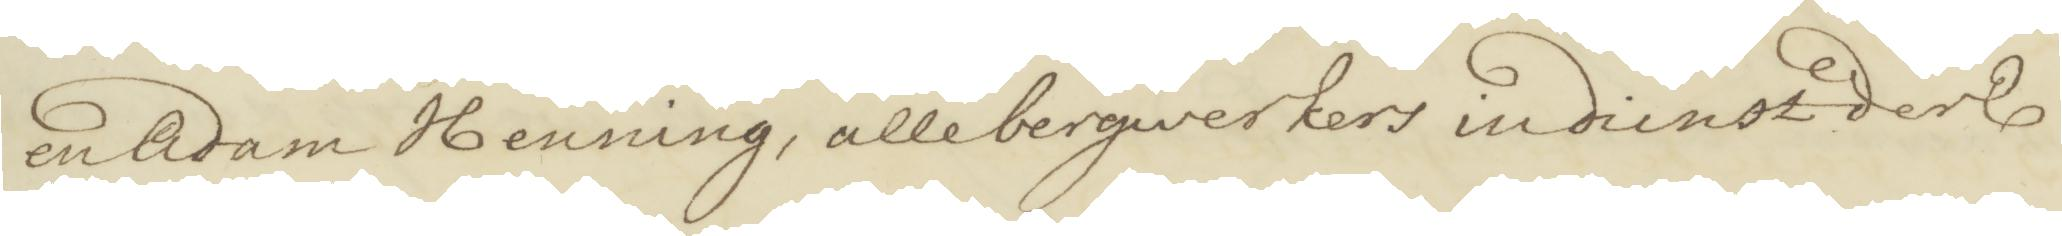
en Adam Henning, alle bergwerkers in dienst der E
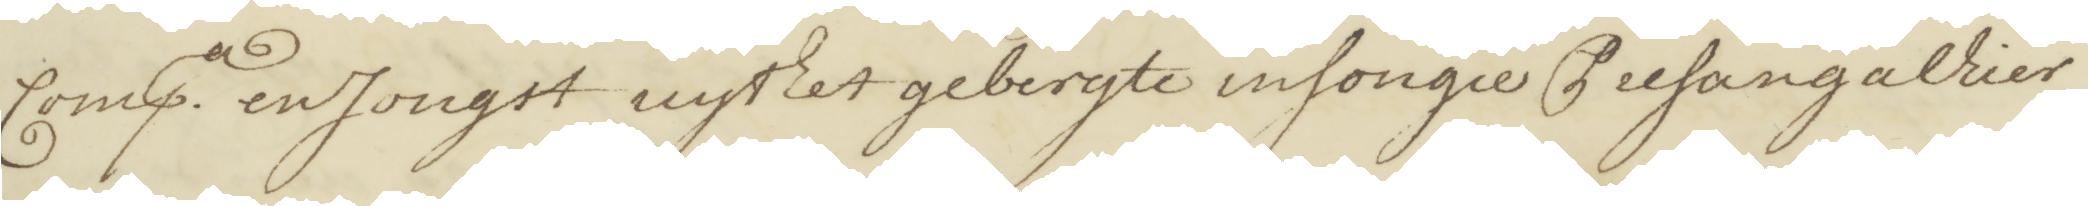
Comp.e en Jongst uyt het gebergte in songie Peesang alhier
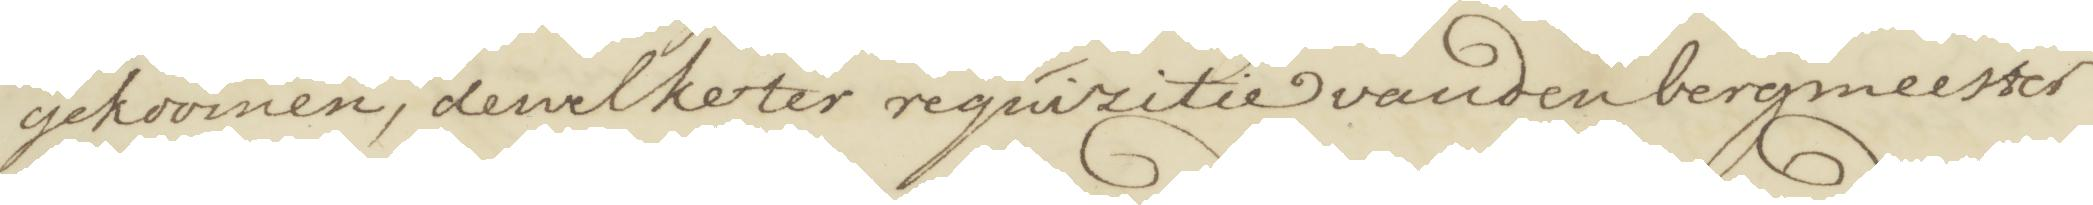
gekoomen, dewelke ter requizitie vanden bergmeester
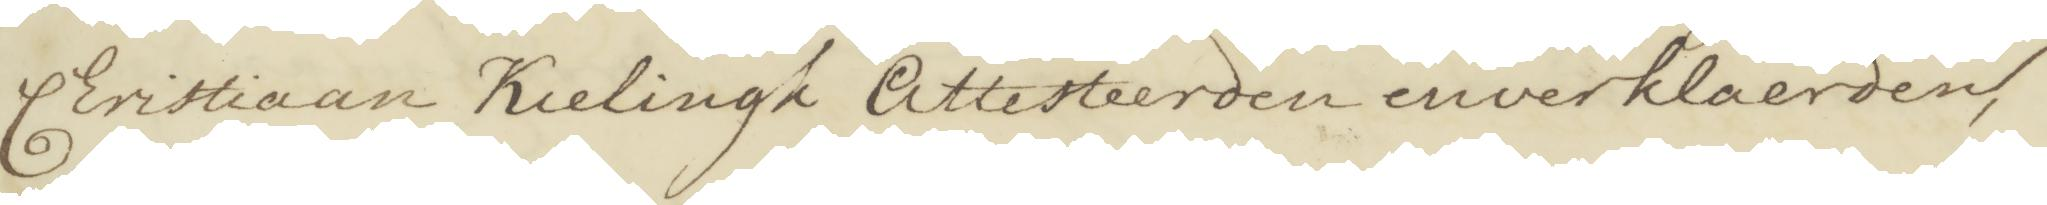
Christiaan Kielingk Attesteerden en verklaerden,
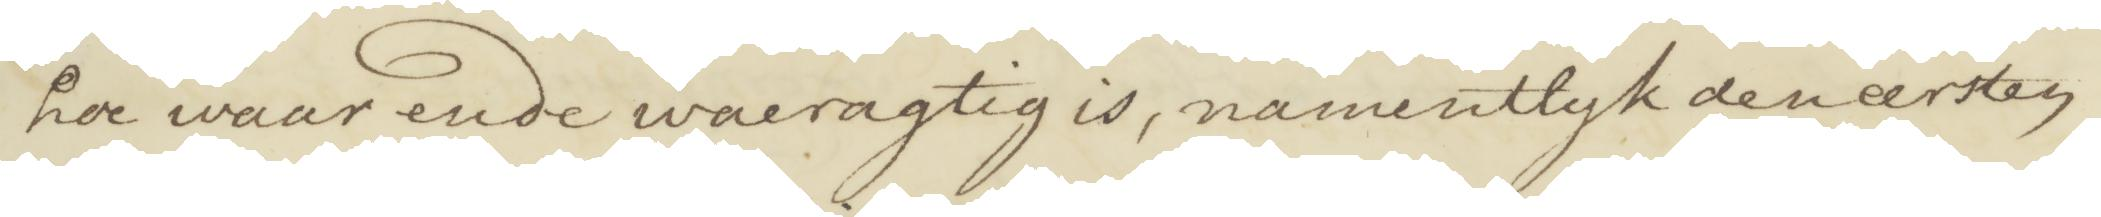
hoe waar ende waeragtig is, namentlyk den eersten
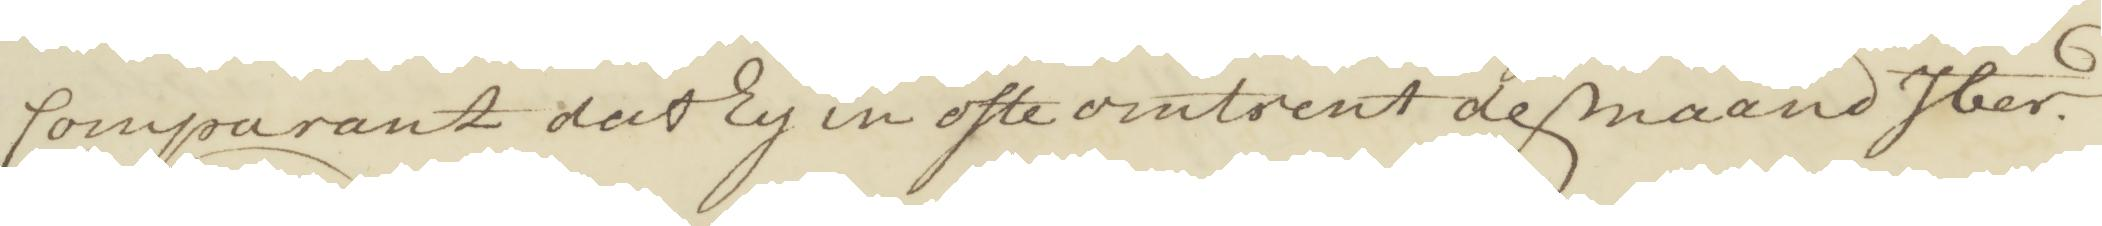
Comparant dat hy in ofte omtrent de maand Jber
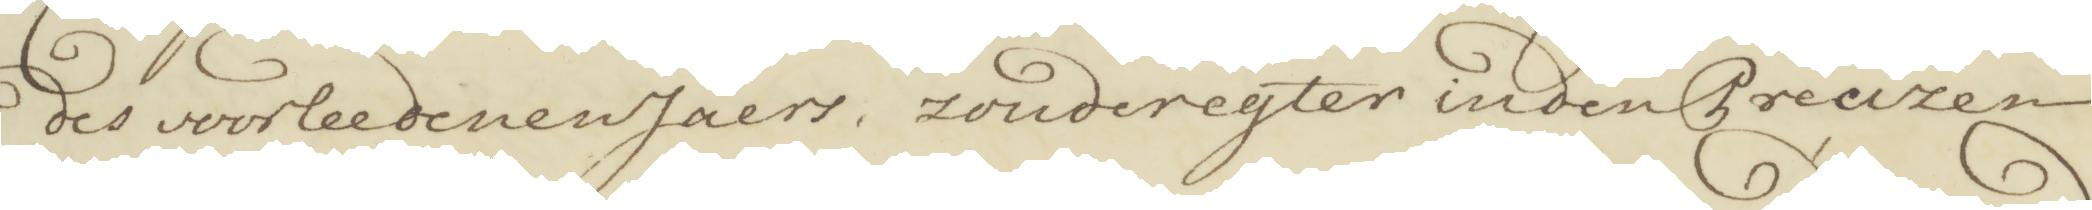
des voorleedenen Jaers, zouderegter in den Precizen
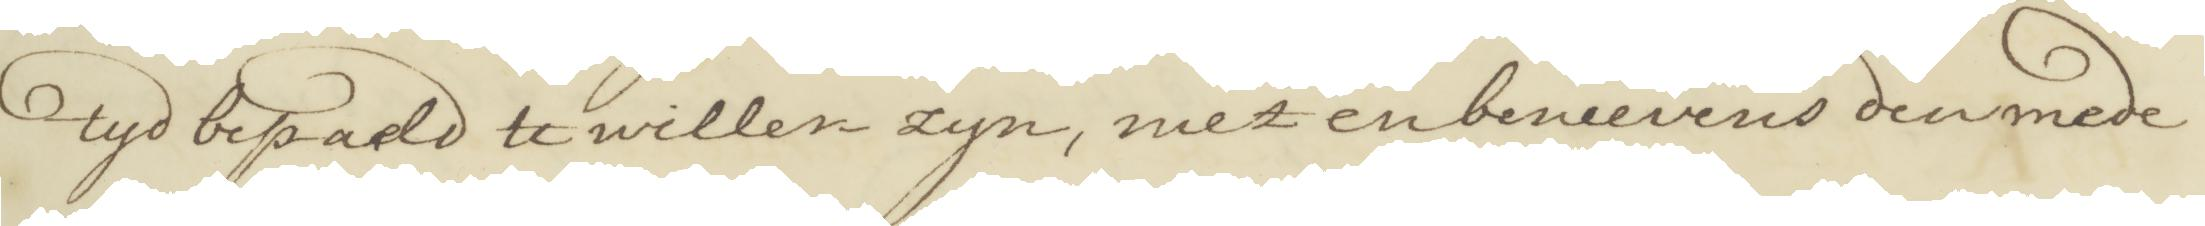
tyd bepaeld te willen zyn, niet en beneevens den mede
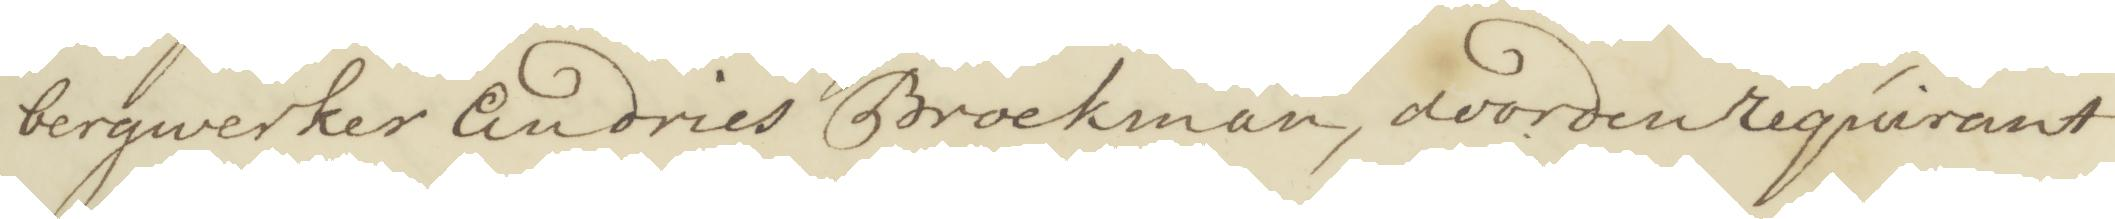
bergwerker Andries Broekman, door den requirant
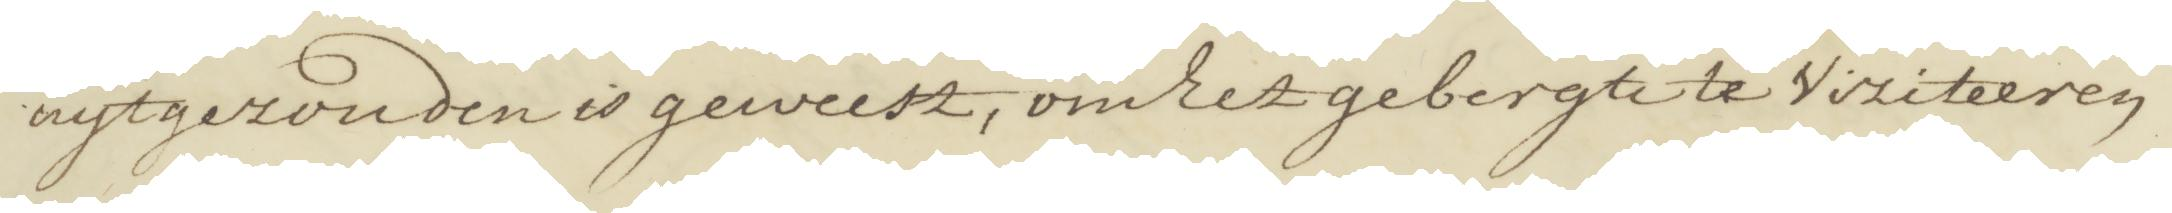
uytgezonden is geweest, om het gebergte te viziteeren
